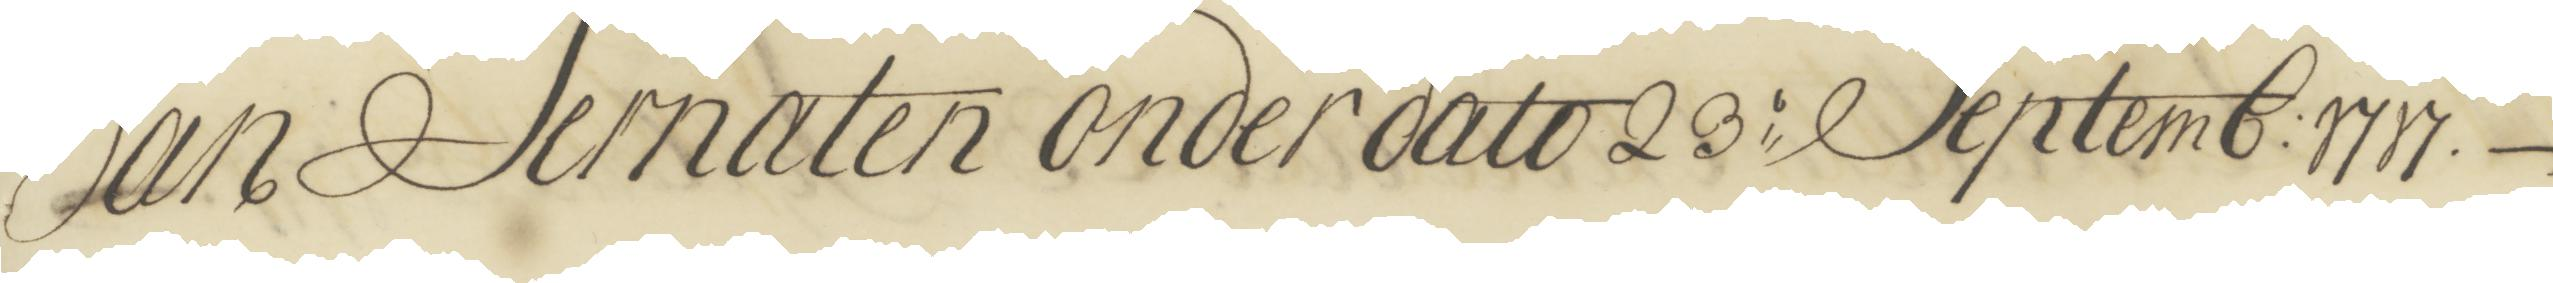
Van Ternaten onder dato 23:' Septemb: 1717. —
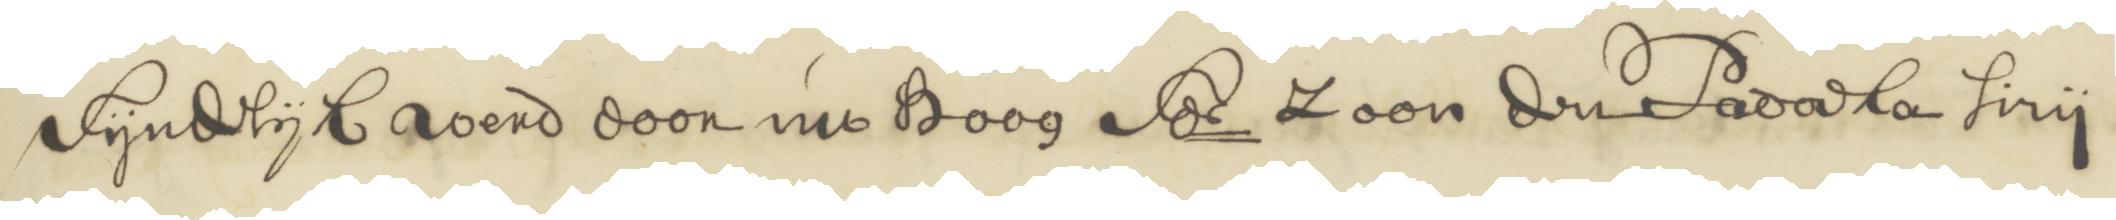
Eijndelijk werd door uw Hoog Ed=s zoon den Padoeka Sirij
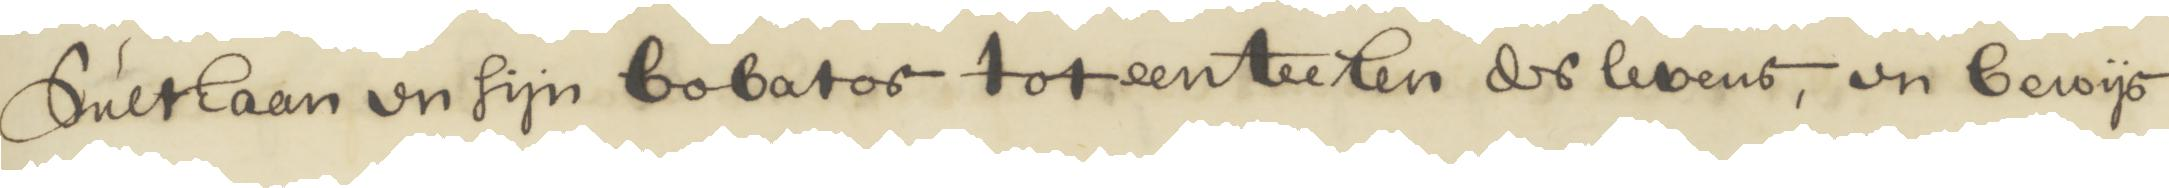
Sulthaan en sijn bobatos tot een teeken des levens, en bewijs
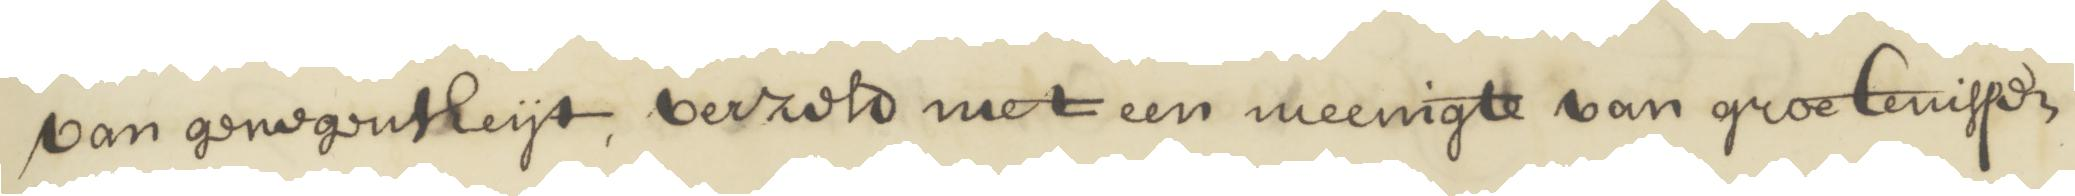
van genegentheijt, verzeld met een meenigte van groetenissen,
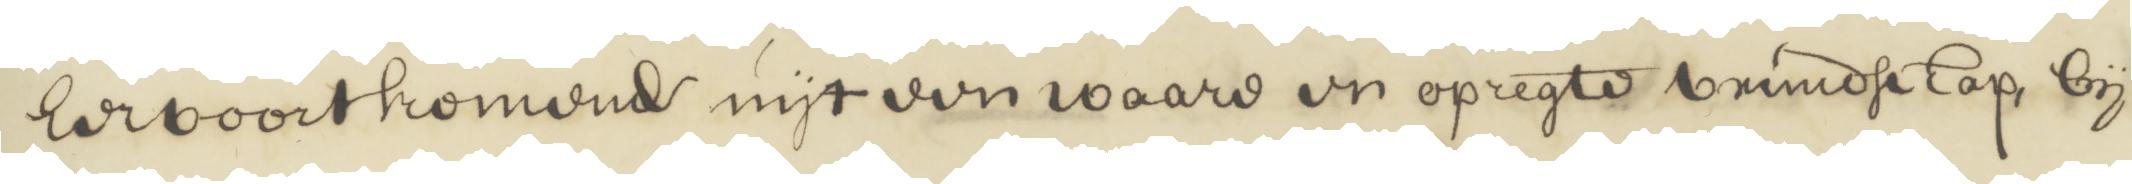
hervoort komende uijt een waare en op regte vrundschap, bij
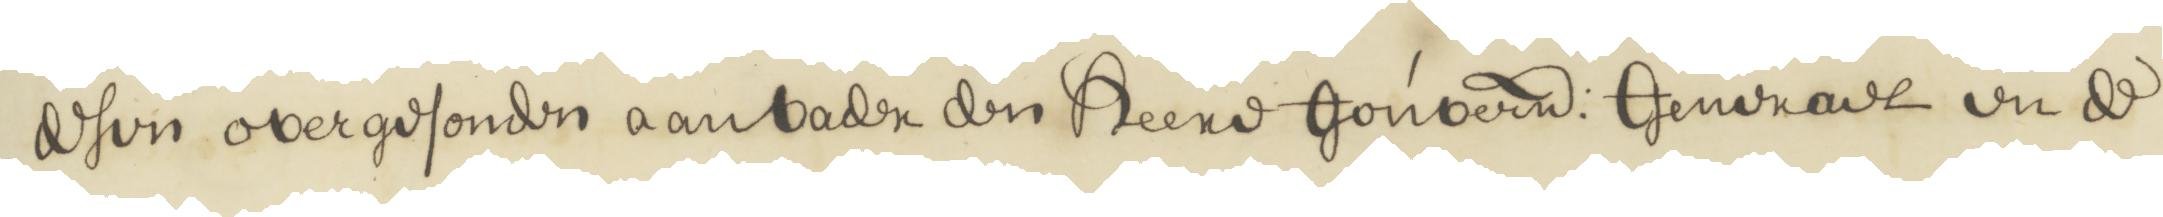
desen overgesonden aan vader den Heere Gouvern: Generael en de
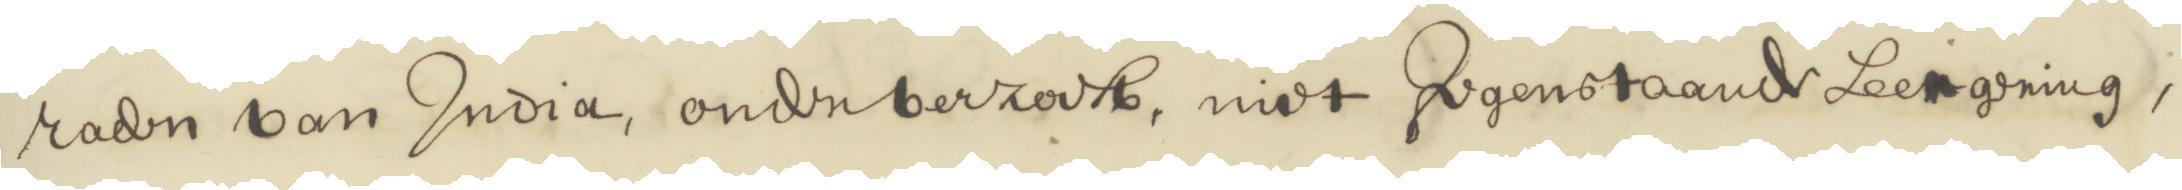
raden van Jndia, onder verzoek, niet Jegenstaande seer gering,
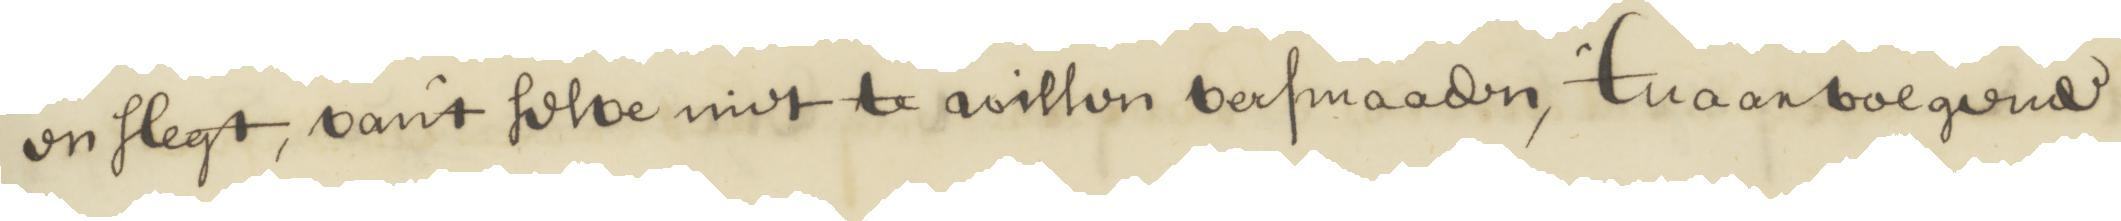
en slegt, van ’t selve niet te willen versmaaden, 't naar volgende
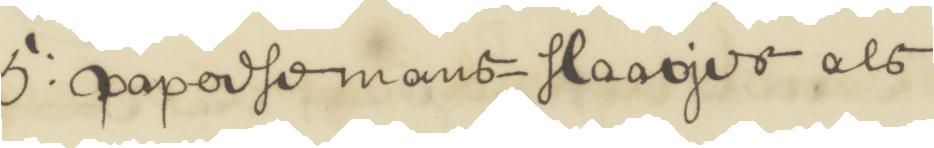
5: papoese mans=slaavjes als
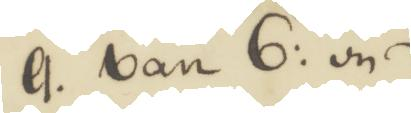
4. van 6: en
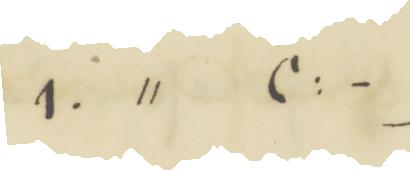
1. „ 5: –
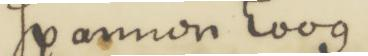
spannen hoog
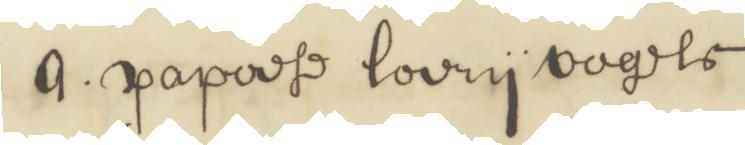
4. papoese loerij vogels
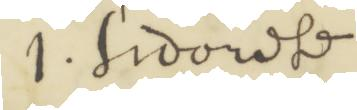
1. tidorese
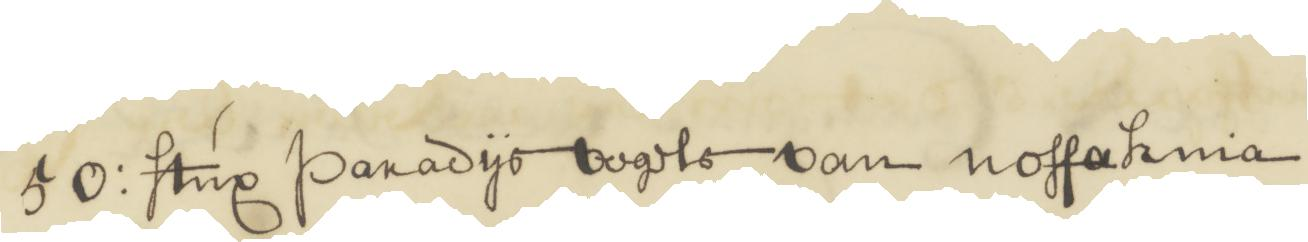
50: stux paradijs vogels van noffa knia
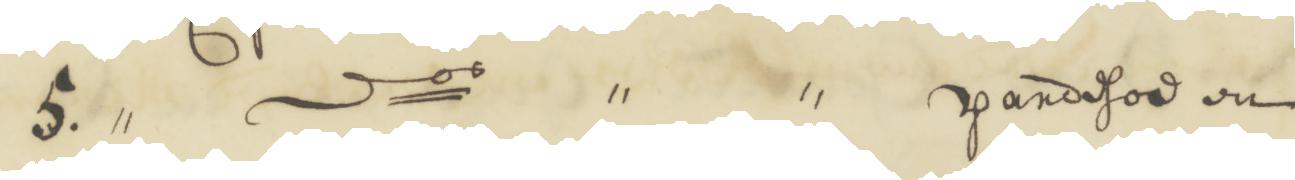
5. „ d=os „ „ pardesoe en
